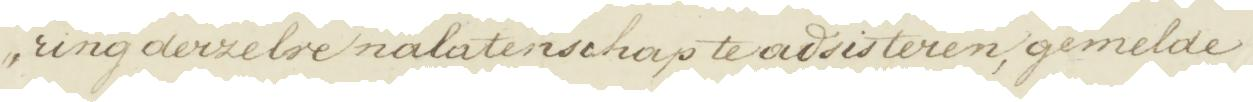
„ring derzelve nalatenschap te adsisteren, gemelde
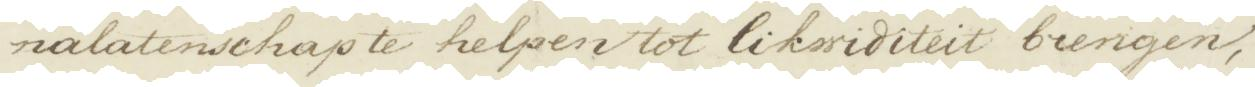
nalatenschap te helpen tot likwiditeit brengen,
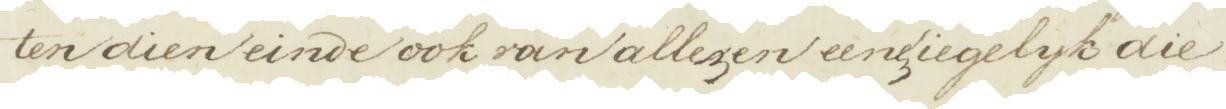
ten dien einde ook van allen en eenen iegelyk die
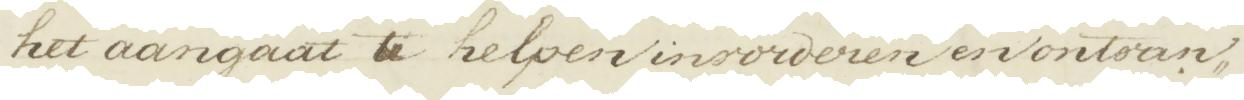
het aangaat te helpen invorderen en ontvan„
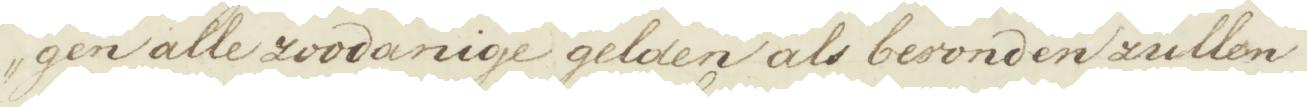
„gen alle zoodanige gelden als bevonden zullen
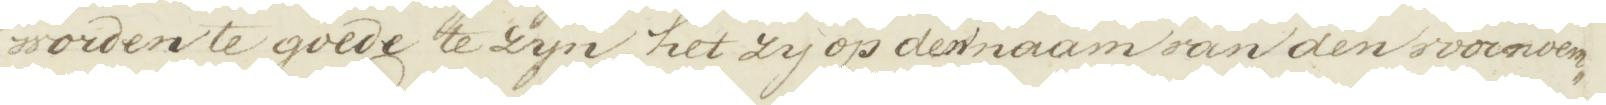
worden te goede te zyn het zy op den naam van den voornoem„
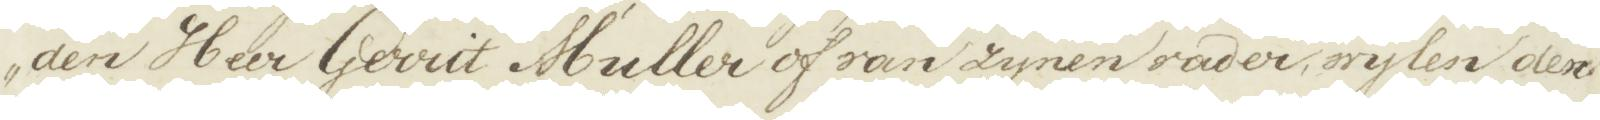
„den Heer Gerrit Muller of van zynen vader, wylen den
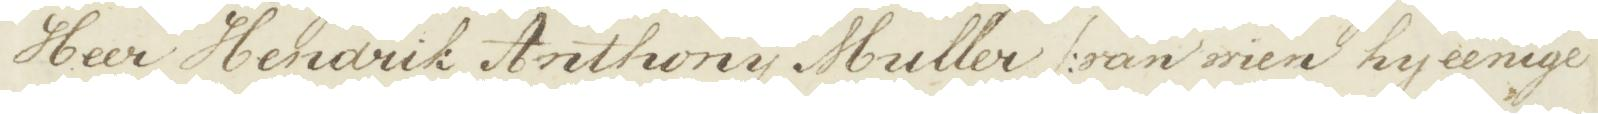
Heer Hendrik Anthony Muller /:van wien hy eenige
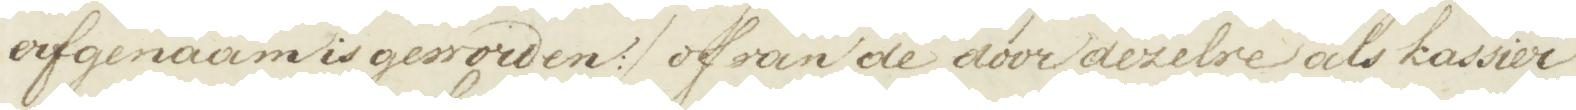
erfgenaam is geworden:/ of van de door dezelve als kassier
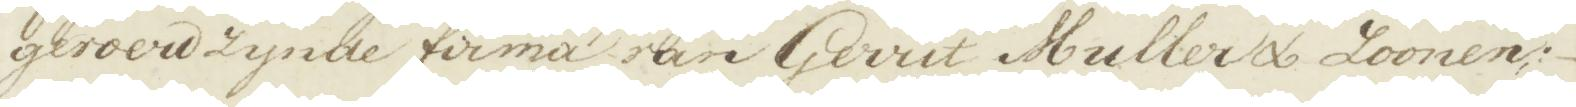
gevoerd zynde firma van Gerrit Muller & Zoonen;
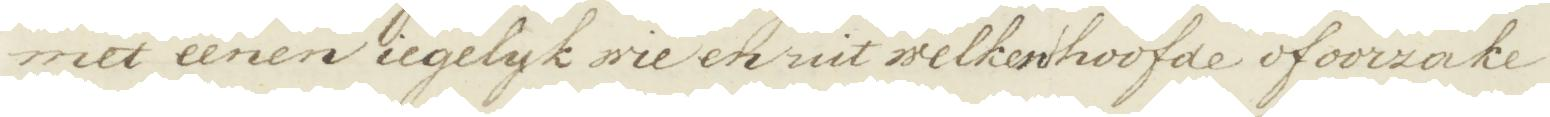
met eenen iegelyk wie en uit welken hoofde of oorzake
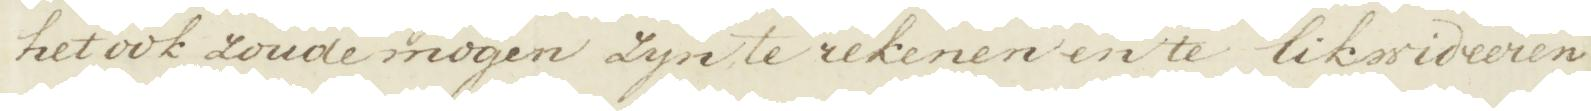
het ook zoude mogen zyn te rekenen en te likwideeren
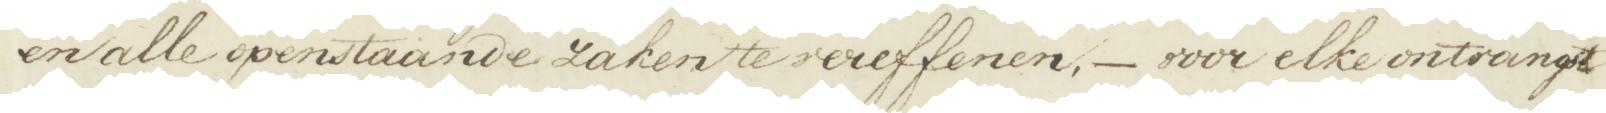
en alle openstaande zaken te vereffenen, — voor elke ontvangst
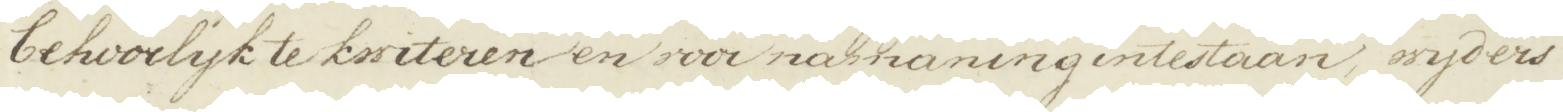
behoorlyk te kwiteren en voor namaning intestaan, wyders
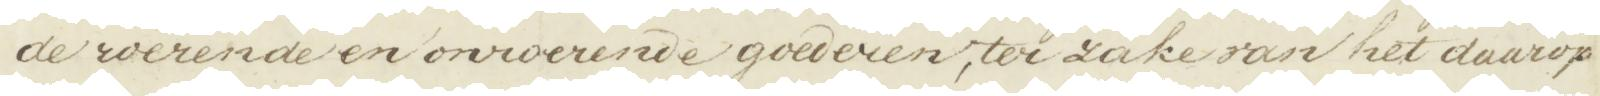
de roerende en onroerende goederen, ter zake van het daarop
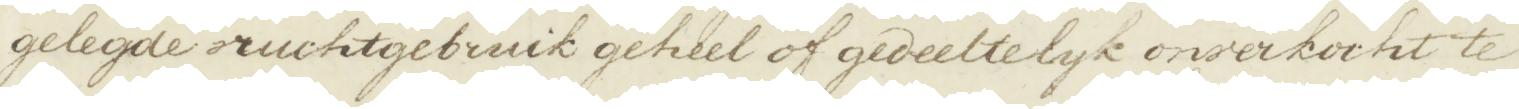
gelegde vruchtgebruik geheel of gedeeltelyk onverkocht te
